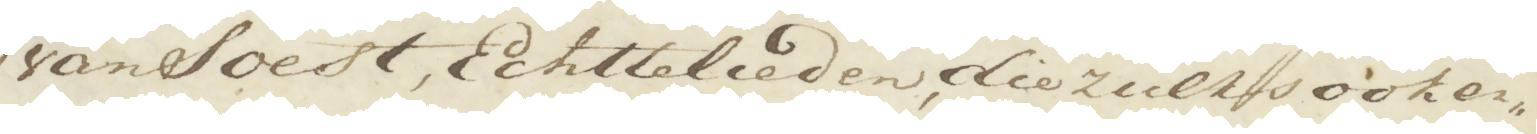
van Soest, Echttelieden, die zulks ook er„
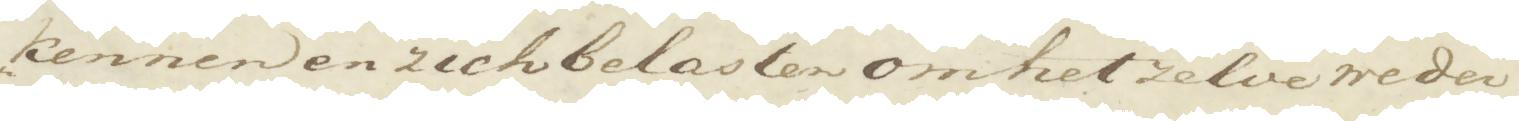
kennen en zich belasten om het zelve weder
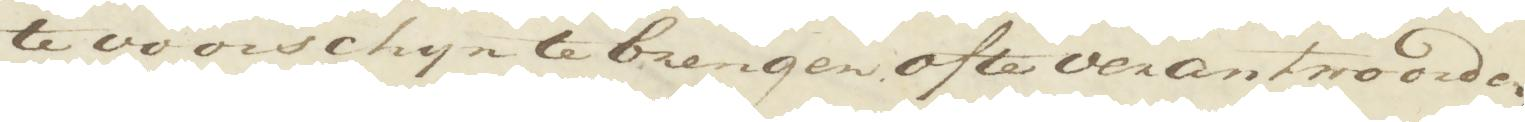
te voorschyn te brengen ofte verantwoorden,
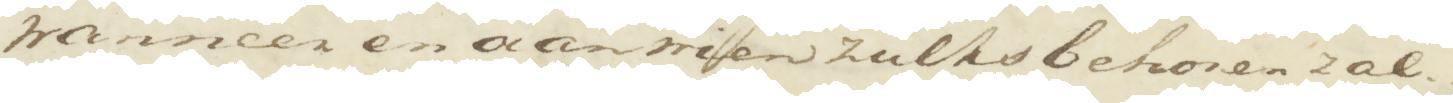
wanneer en aan wien zulks behoren zal.
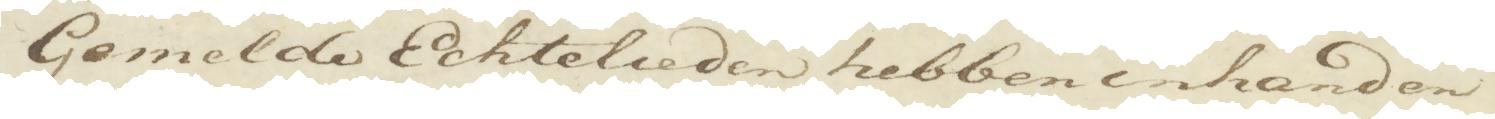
Gemelde Echtelieden hebben in handen
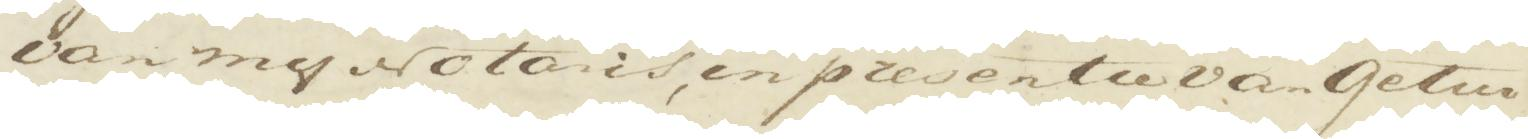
van my Notaris, in presentie van getui
